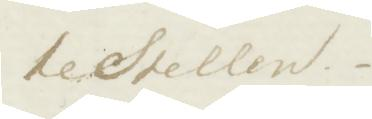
te stellen.
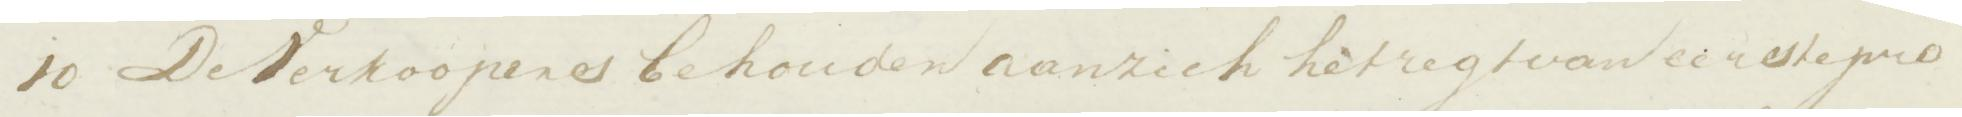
10 De Verkoopers behouden aanzich het regt van eerste pro
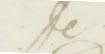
fe
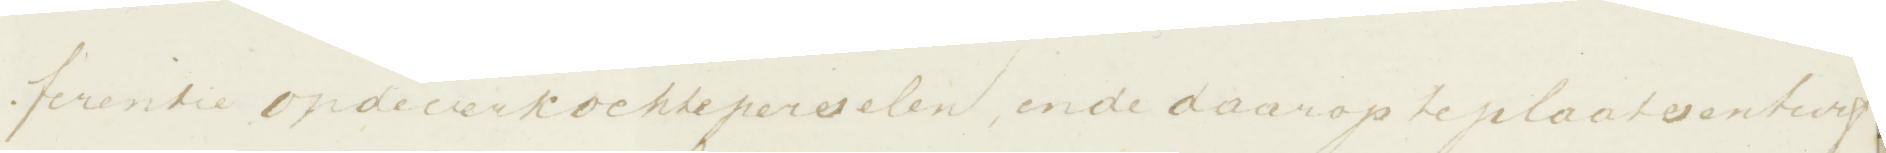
ferentie op de verkochte perselen, ende daarop te plaatsen turf
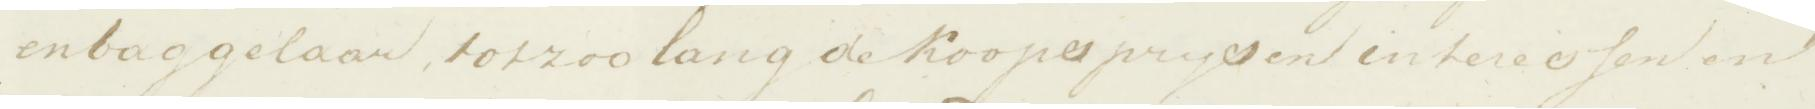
en baggelaar, tot zoo lang de koopsprysen interessen en
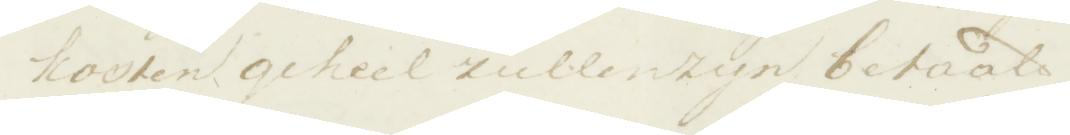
kosten geheel zullen zyn betaald
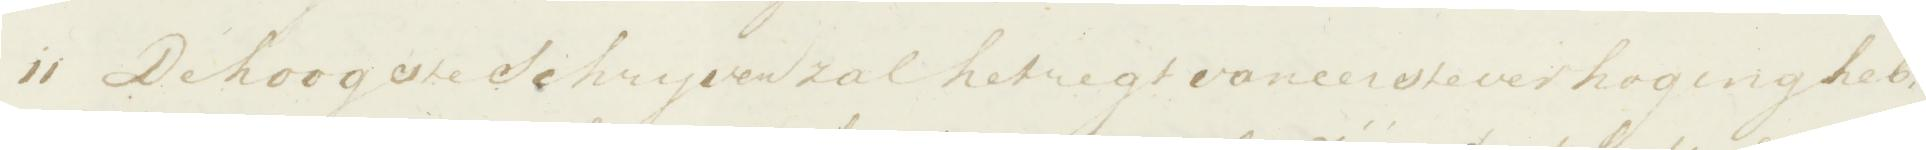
11 De hoogste schryver zal het regt van eerste verhoging heb,
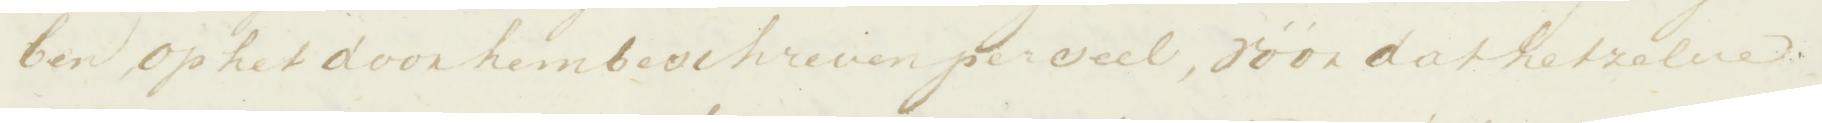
ben, op het door hem beschreven perseel, vóór dat hetzelve
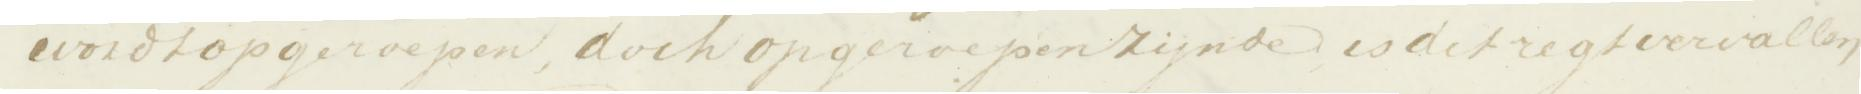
wordt opgeroepen, doch opgeroepen zijnde is dit regt vervallen
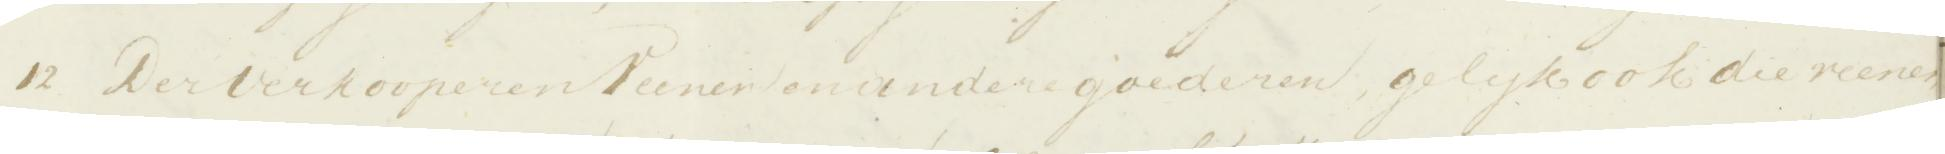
12. Der verkooperen Veenen en andere goederen, gelyk ook die veenen
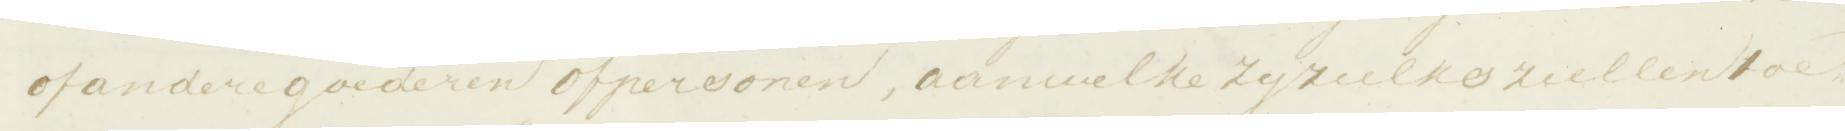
of andere goederen of personen, aanwelke zy zulks zullen toe„
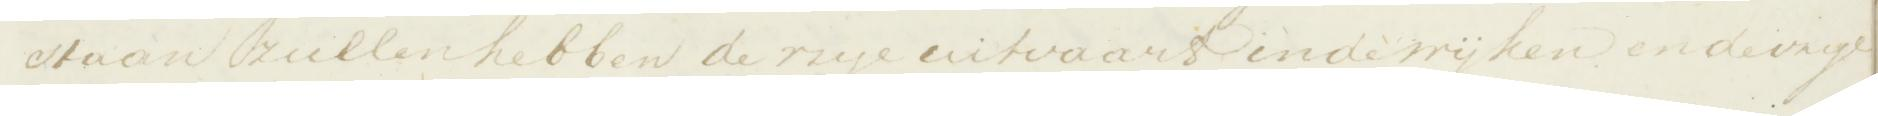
staan zullen hebben de vrye uitvaart in de wijken, en de vrye
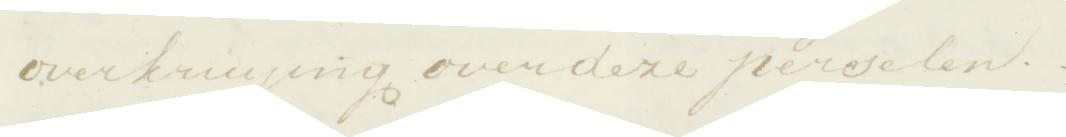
overkruising over deze perselen.
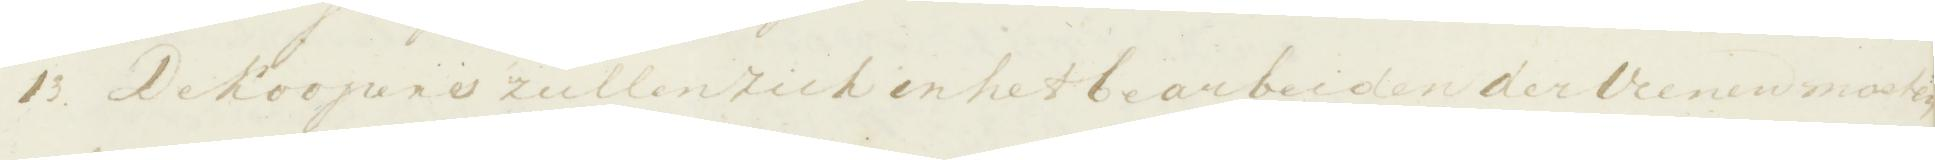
13. De koopers zullen zich in het bearbeiden der Veenen moeten
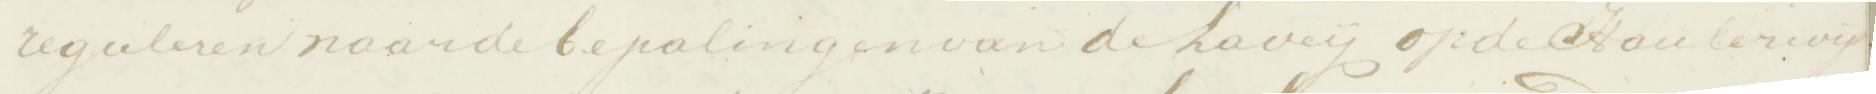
reguleren naar de bepalingen van de Laveij op de Haulerwy
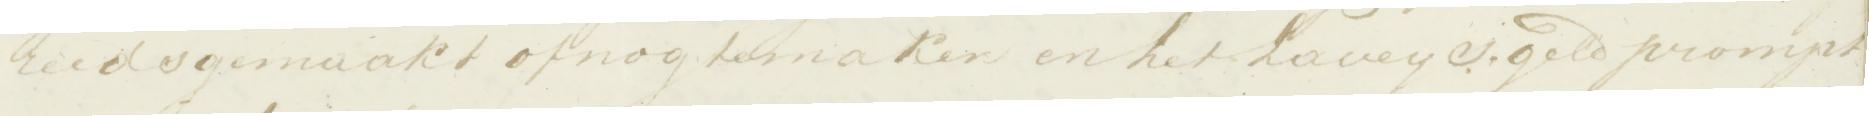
reeds gemaakt of nog temaken en het Laveys geld prompt
